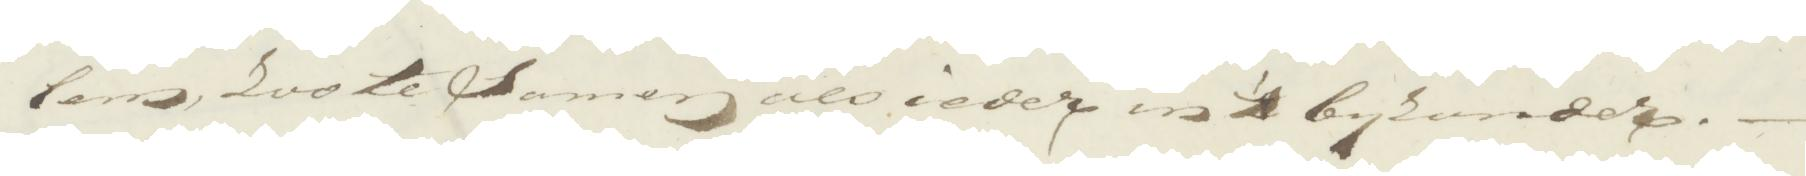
lem, zoo te samen als ieder in 't byzonder.
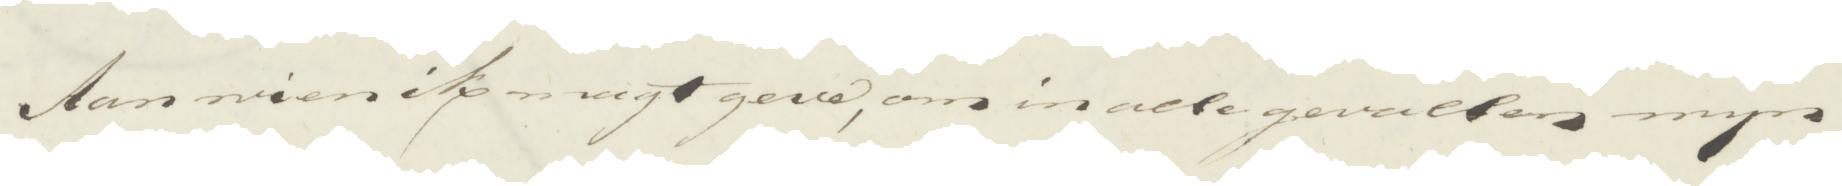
Aan wien ik magt geve, om in alle gevallen myn
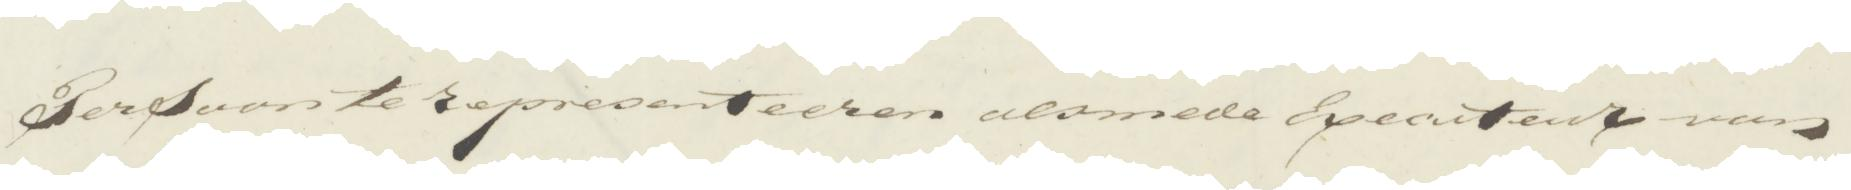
Persoon te representeeren alsmede Executeur van
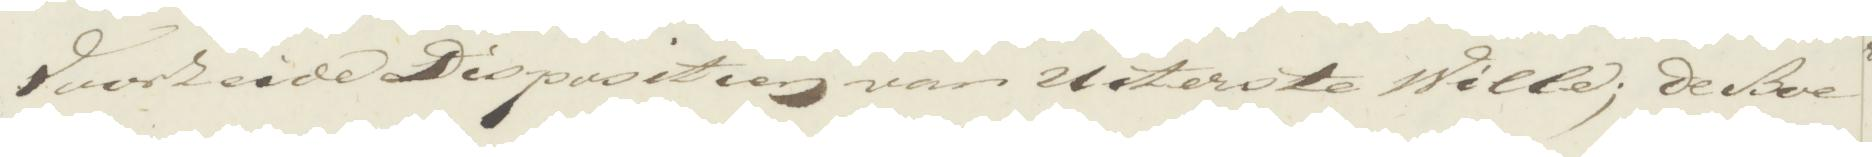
Voorzeide Dispositien van uiterste Wille; de Boe
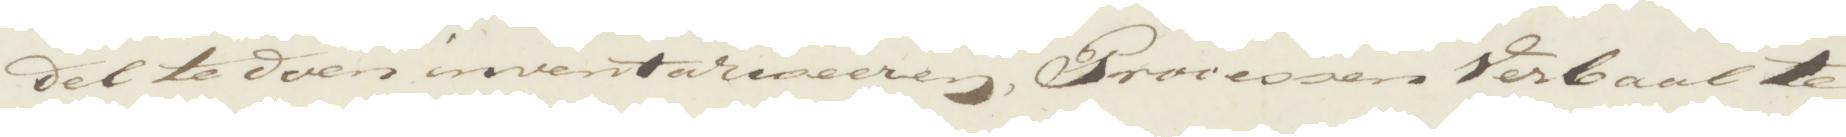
del te doen inventariseeren, Processen Verbaal te
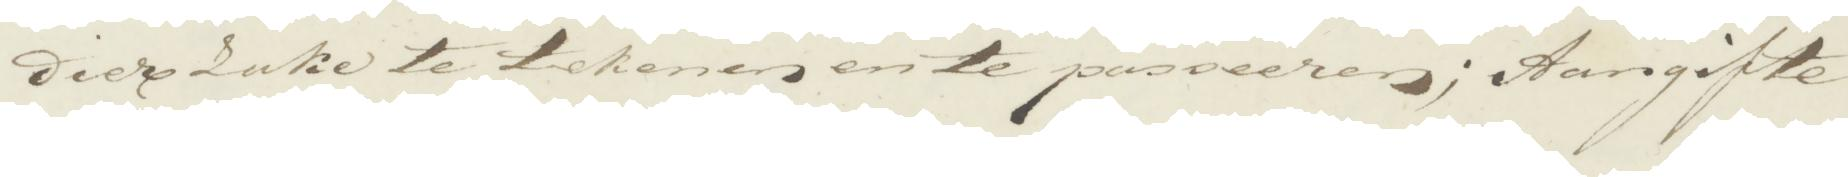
dier zake te tekenen en te passeeren; Aangifte
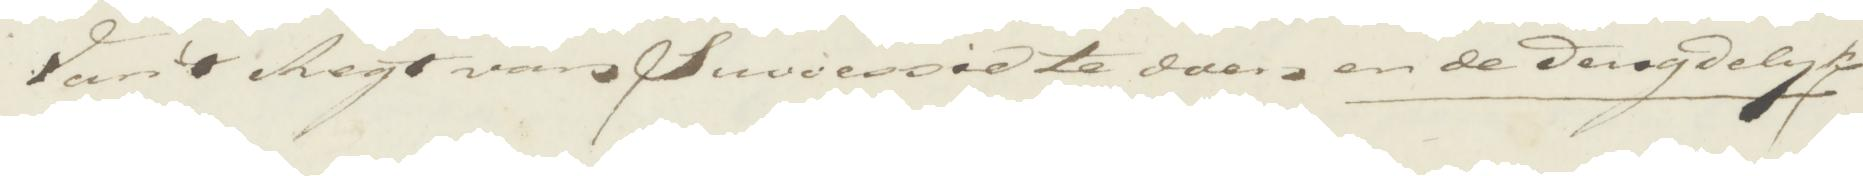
van 't Regt van Successie te doen en de deugdelyk
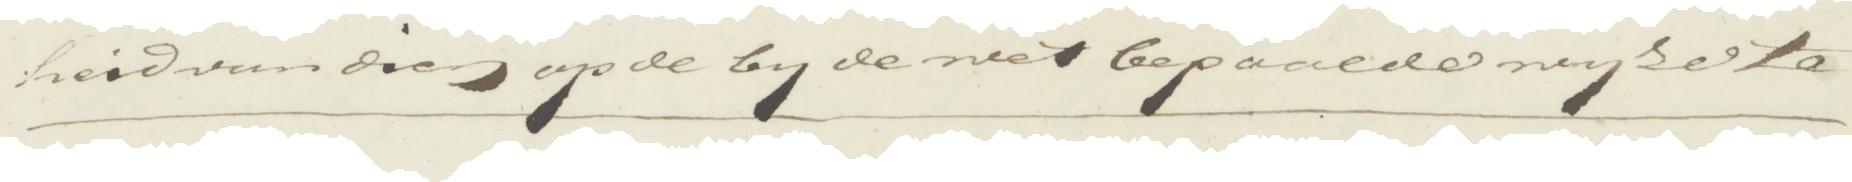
heid van dien op de by de wet bepaalde wyze te
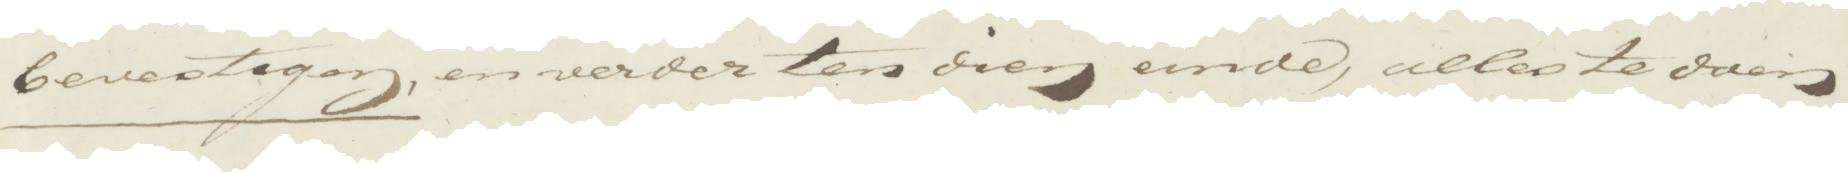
bevestigen, en verder ten dien einde, alles te doen
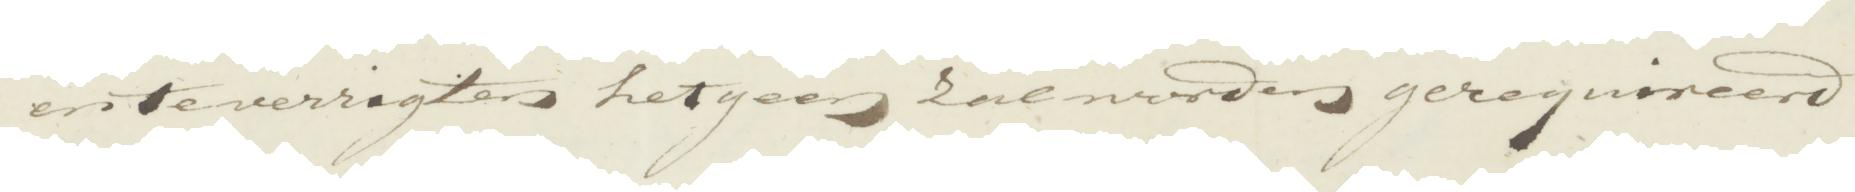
en te verrigten het geen zal worden gerequireerd
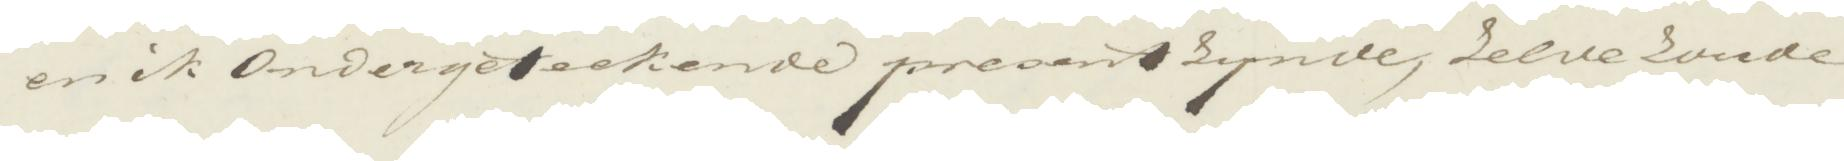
en ik ondergeteekende present zynde, zelve zoude
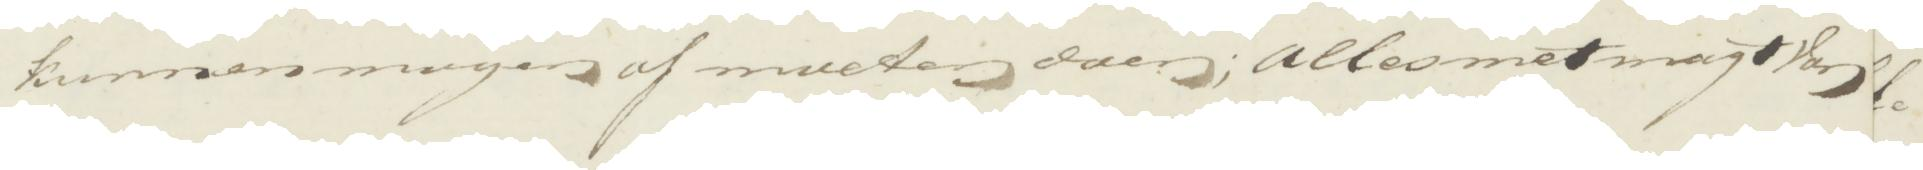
kunnen mogen of moeten doen; alles met magt van
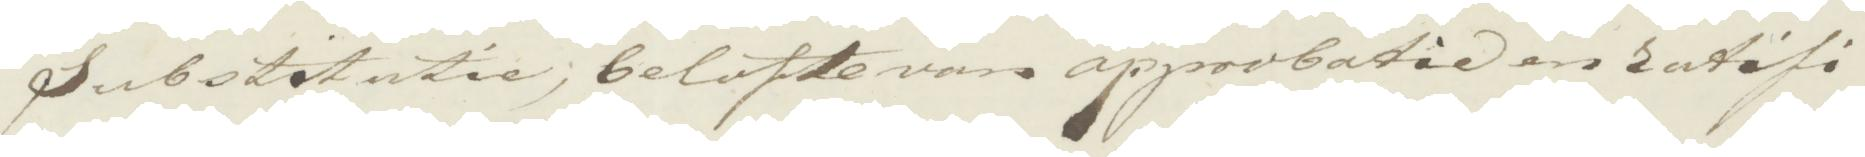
substitutie, belofte van approbatie en ratifi
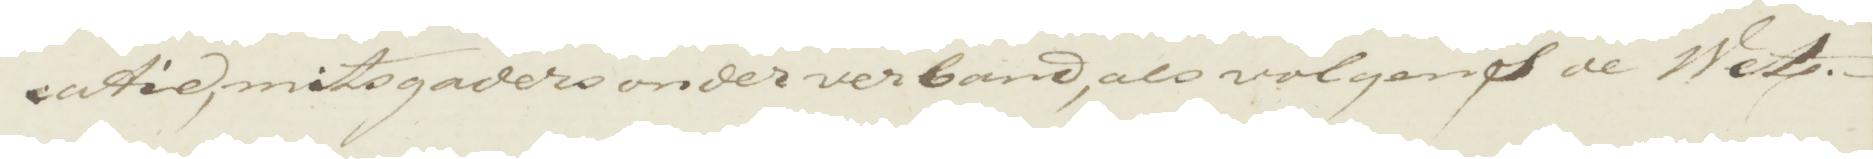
catie, mitsgaders onder verband, als volgens de Wet. -
